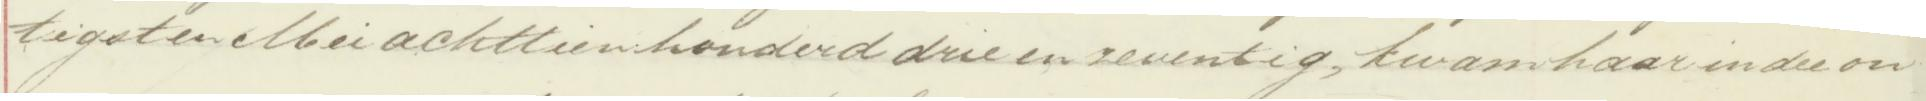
tigsten Mei achttien honderd drie en zeventig, kwam haar in die on
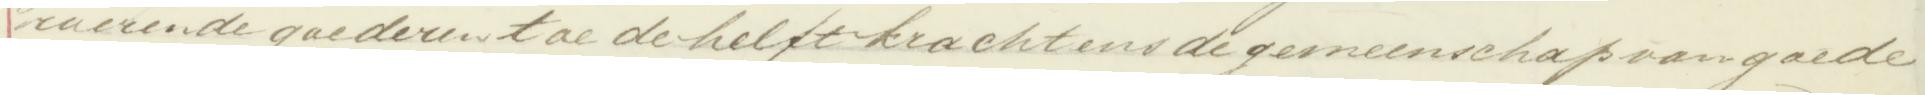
roerende goederen toe de helft krachtens de gemeenschap van goede
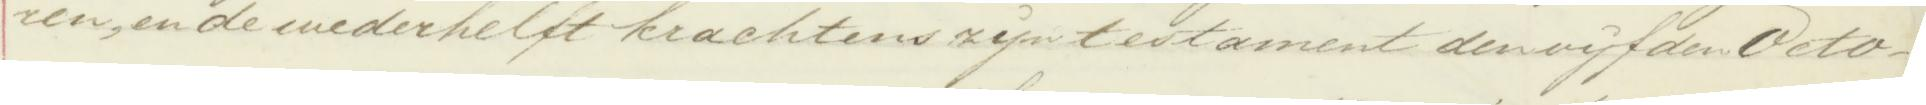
ren, en de wederhelft krachtens zijn testament den vijfden Octo-
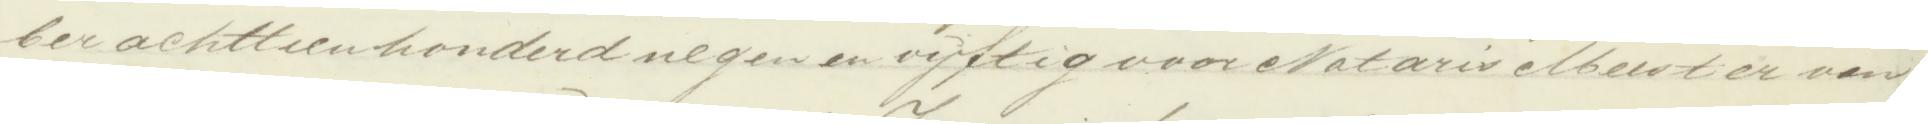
ber achttienhonderd negen en vijftig voor Notaris Meester van
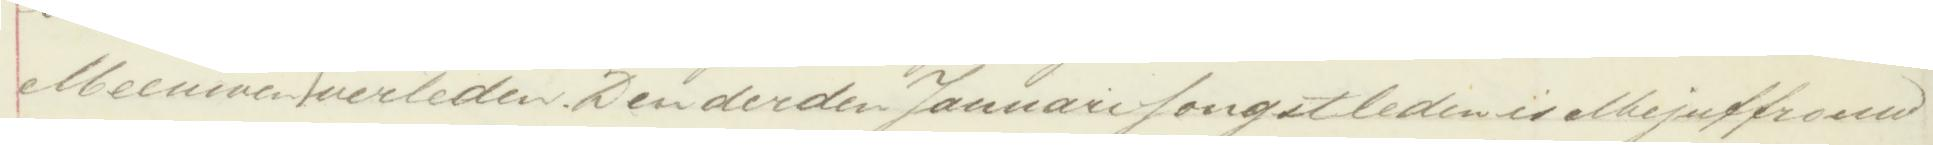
Meeuwen ]verleden. Den derden Januari jongstleden is Mejuffrouw
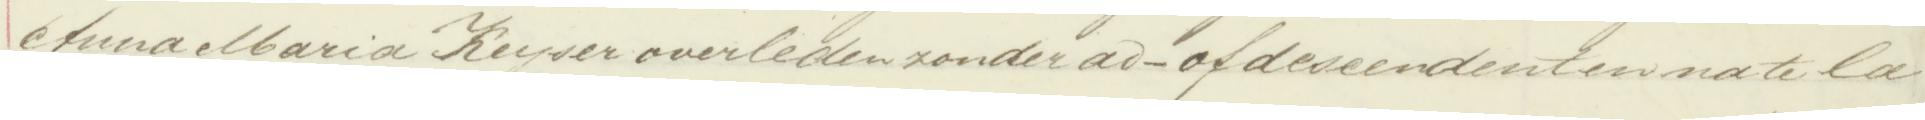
Anna Maria Keyser overleden zonder ad- of descendenten na te la
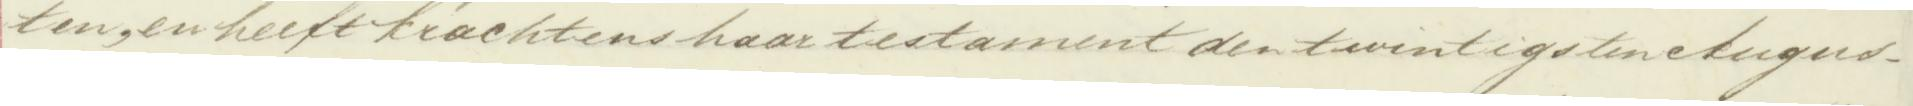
ten, en heeft krachtens haar testament den twintigsten Augus-
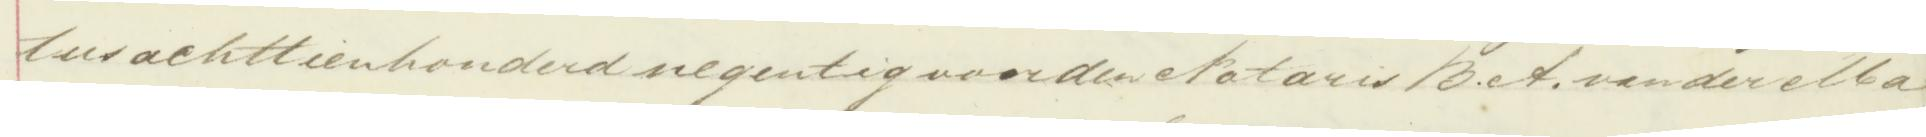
tus achttienhonderd negentig voor den Notaris B. A. van der Ma
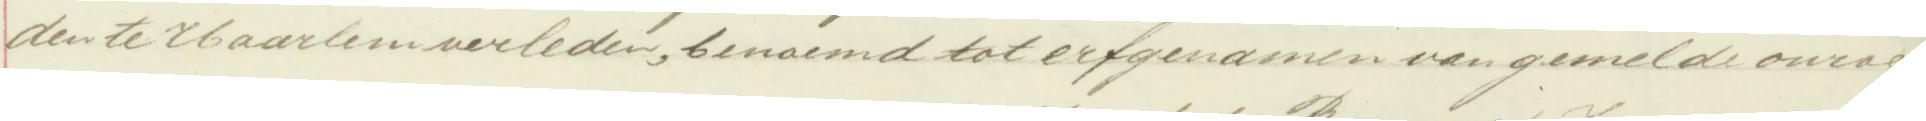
den te Haarlem verleden, benoemd tot erfgenamen van gemelde onroe
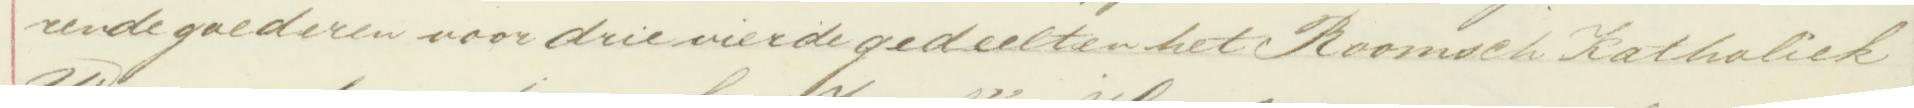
rende goederen voor drie vierde gedeelten het Roomsch Kathaliek
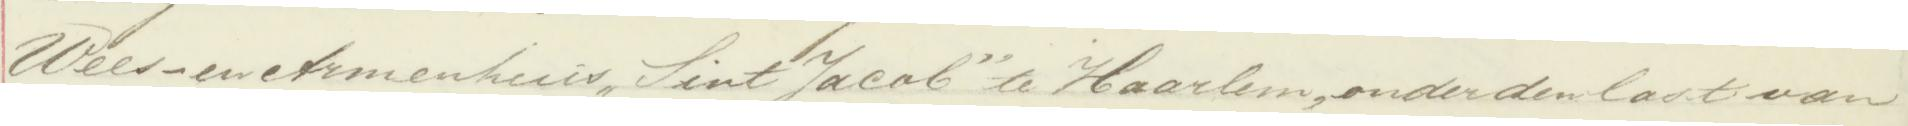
Wees- en Armenhuis, Sint Jacob te Haarlem, onder den last van
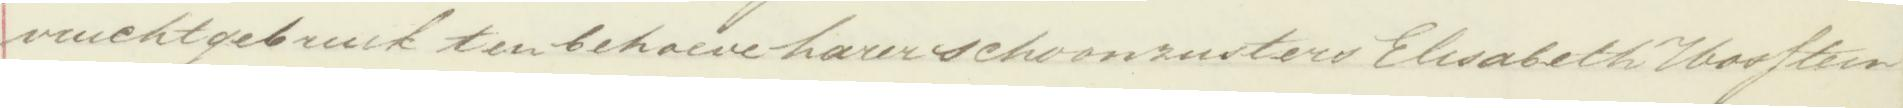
vruchtgebruik ten behoeve harer schoonzusters Elisabeth Hosstein
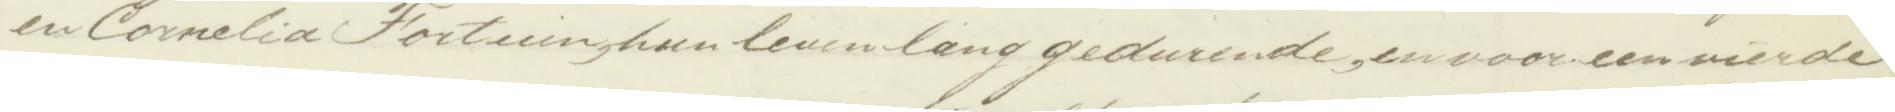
en Cornelia Fortuin, hun leven lang gedurende, en voor een vierde
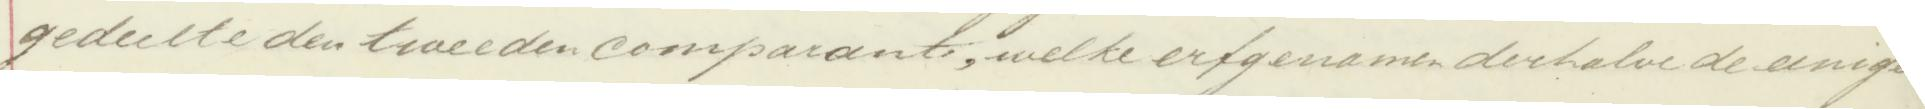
gedeelte den tweeden comparant, welke erfgenamen derhalve de eenige
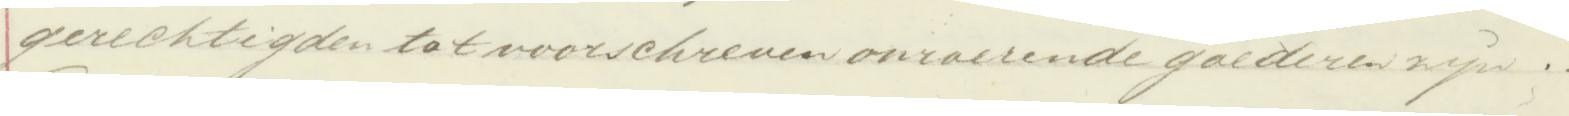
gerechtigden tot voorschreven onroerende goederen zijn.
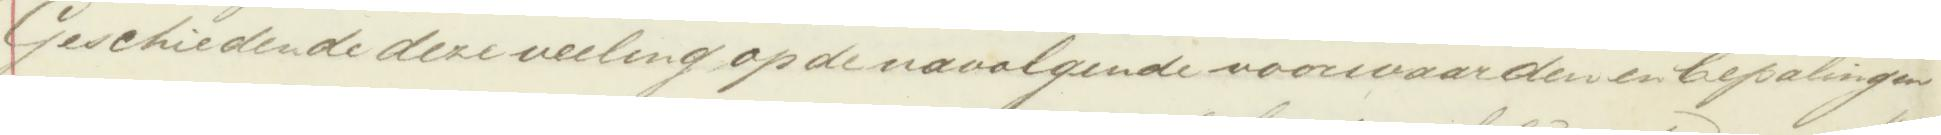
Geschiedende deze veeling op de navolgende voorwaarden en bepalingen
